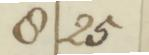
8 25
